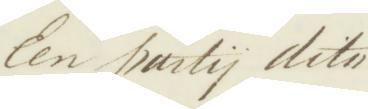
Een partij dito
